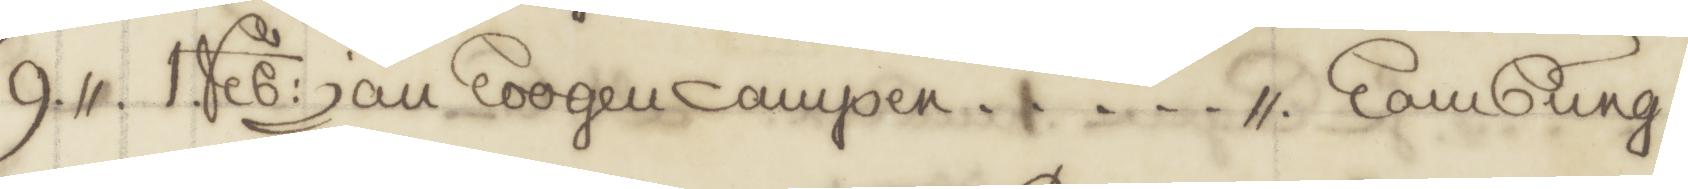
9. „ . 1. feb: jan hoogen camper . . . - - „ . hamburg
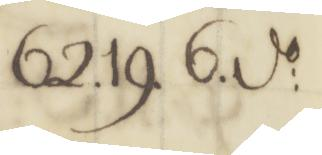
62.19. 6. d:o
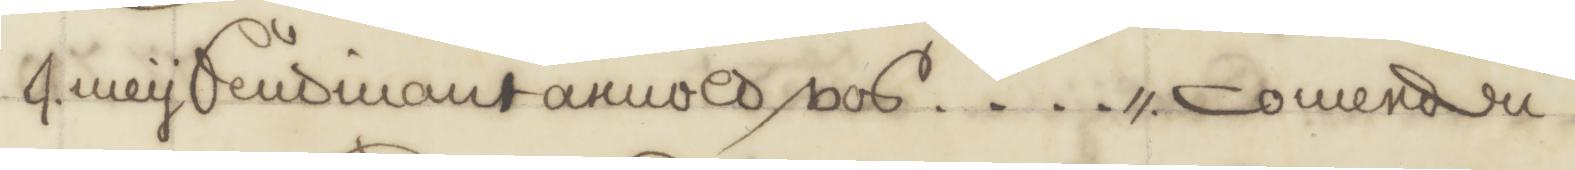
4. meij fendinant arnold vos . . . . „. comerden
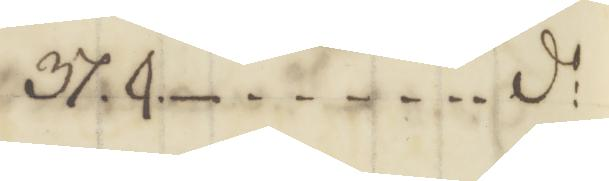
_:o 37:4. — - - - - - - d:o
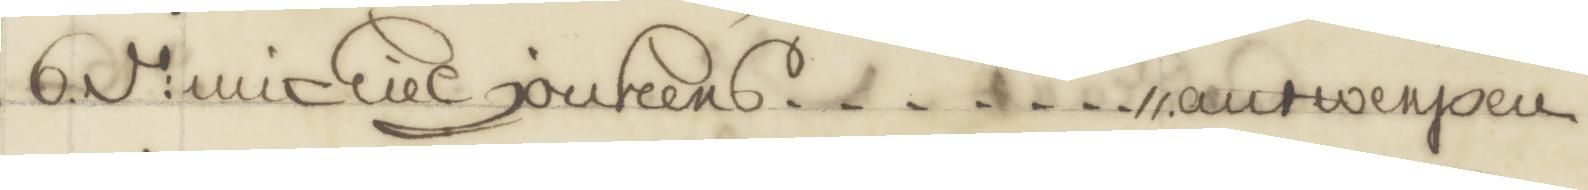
6. d:o michiel jonkers - - - - - - - „. antwerpen
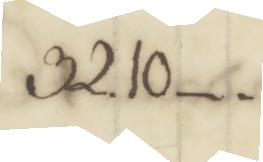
32.10
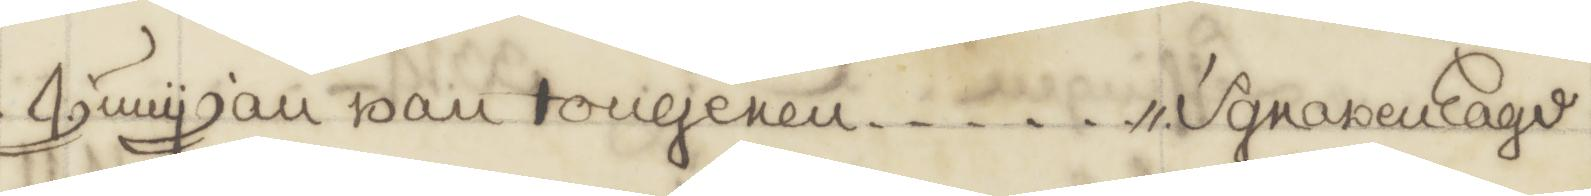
4. junij jan van tongeren - - - . . .„. 's gravenhage
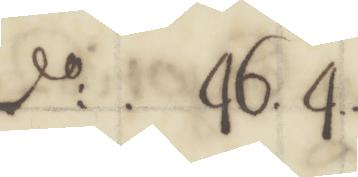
_:o . 46. 4
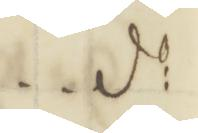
. . d:o
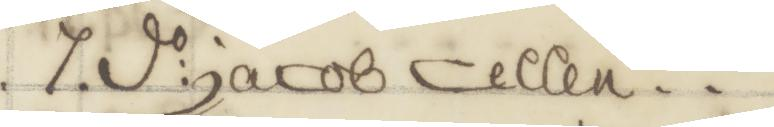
7. d:o jacob celler - -
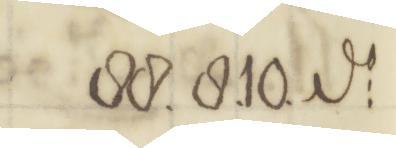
88. 8.10. d:o
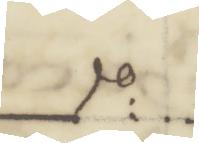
_:o .
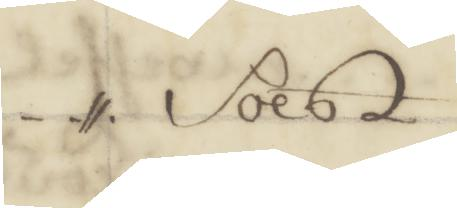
- -„. Soest
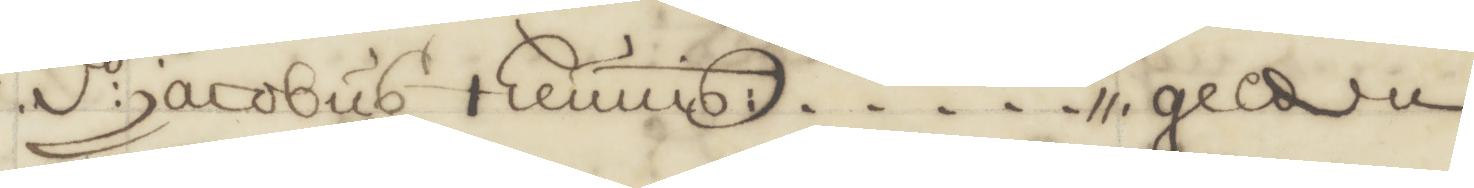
. d:o jacobus theunis: - - - - - „. gelden
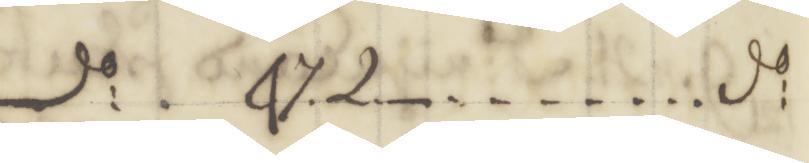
_:o 47.2. — . - - - . . . d:o
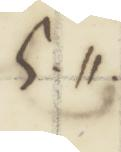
5. „
